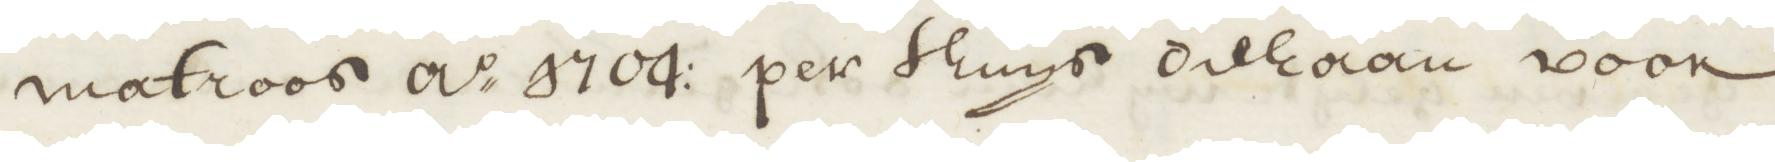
matroos a„o 1704: per thuijs de haan voor
